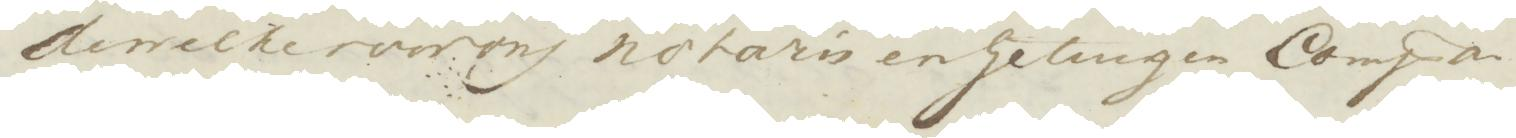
dewelke voor ons notaris en getuigen Compa
